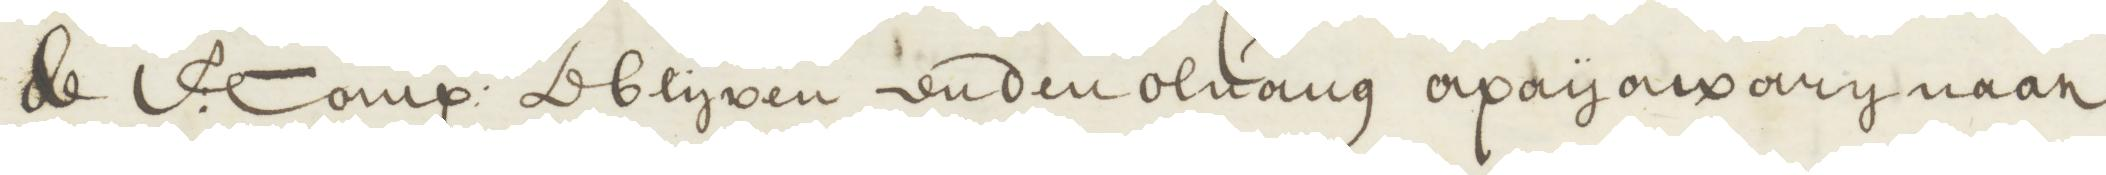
de E: Comp:e te blijven en den oluang apaijawary naar
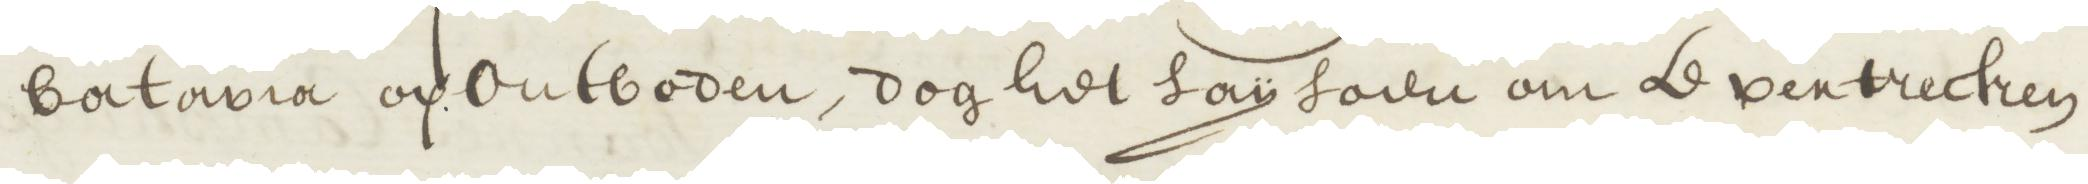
batavia op.ontboden, dog het saij soen om te vertrecken
